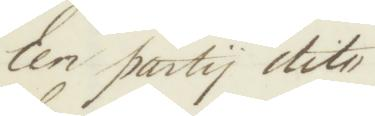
Een partij dito
